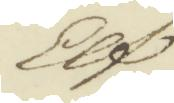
Elf
